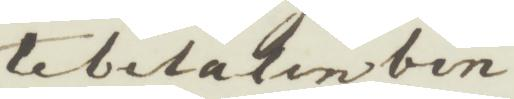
te betalen bin
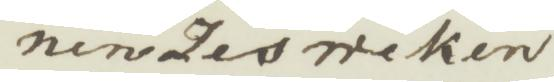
nen zes weken
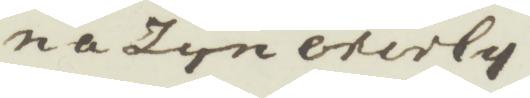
na zyn overly
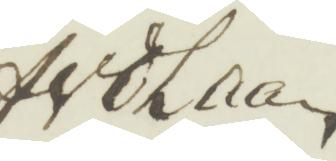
AvdLaan
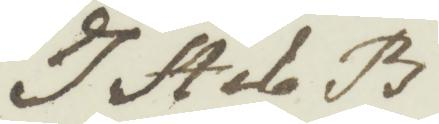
J A d B
